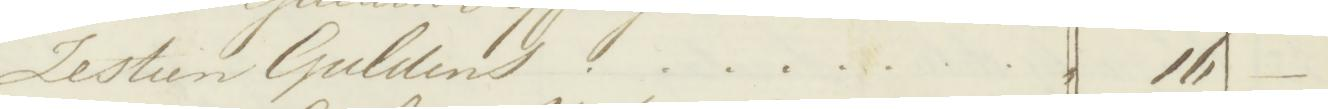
Zestien Guldens . . . . . . . . „ 16 —
